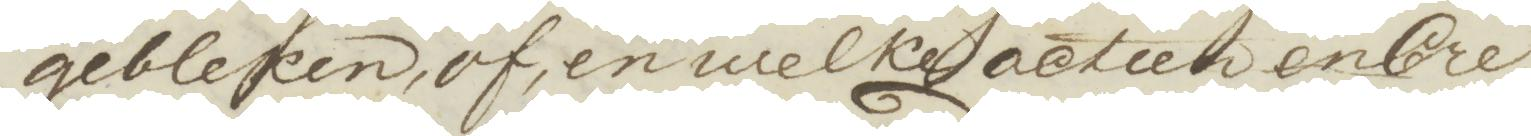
gebleken, of, en welke actien en Cre
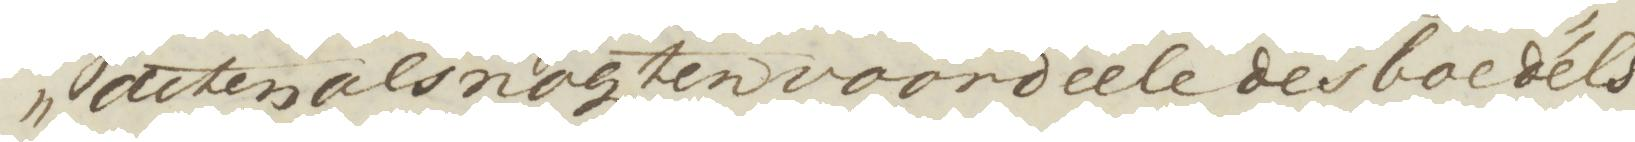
„diten als nog ten voordeele des boedels
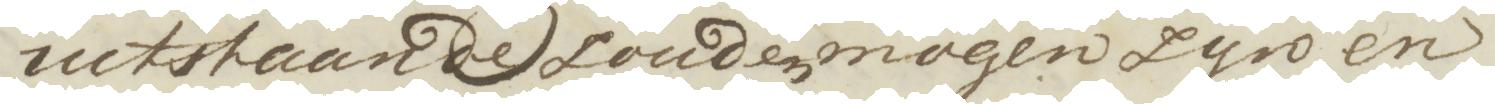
uitstaande zouden mogen zyn en
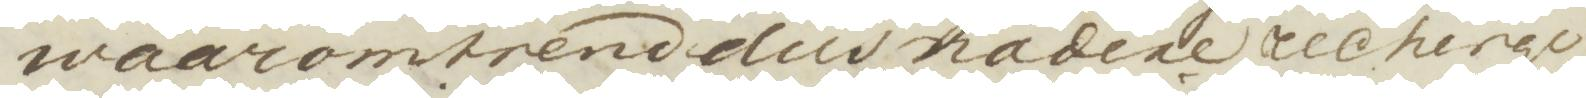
waaromtrend dus nadere recherge
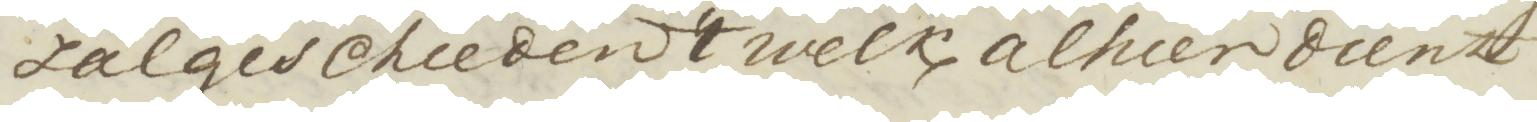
zal geschieden ’t welk alhier dient
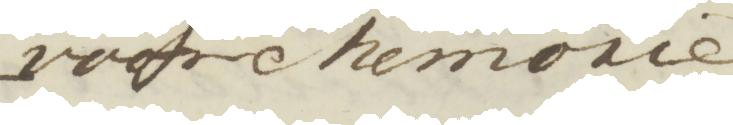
voor Memorie
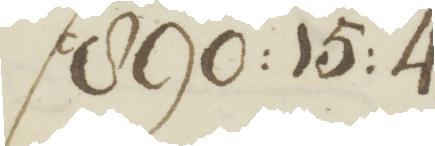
ƒ890:15:4
